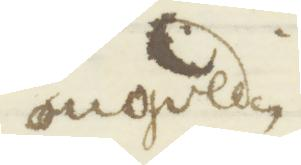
ongelden
